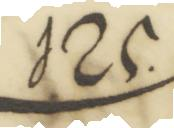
125.
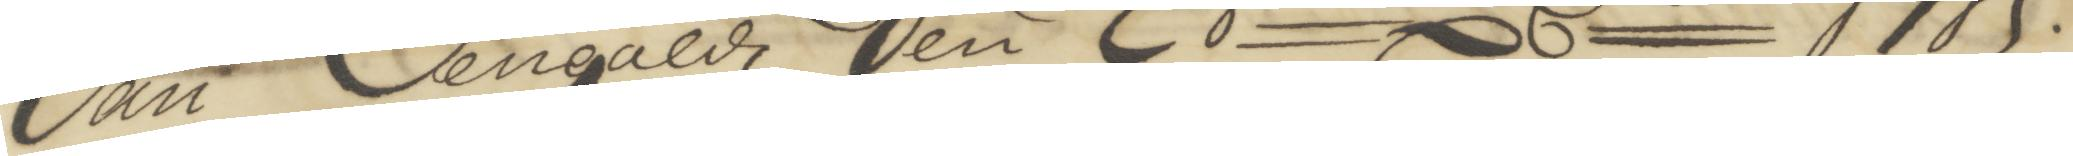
Van Bengalen den 28=e xb=r 1715.
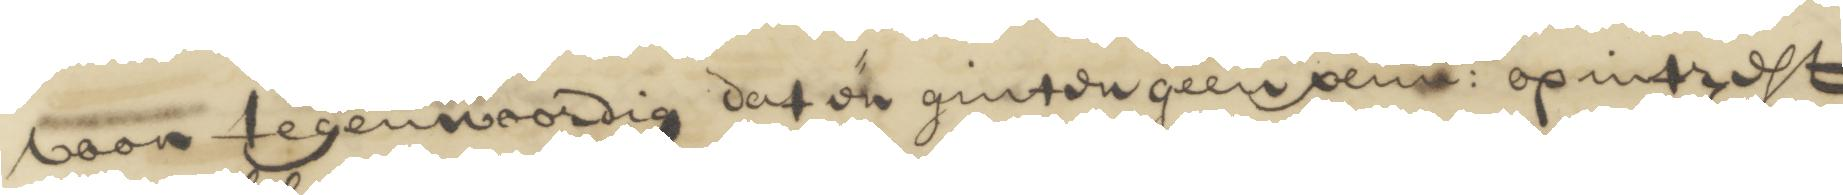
voor tegenwoordig dat er ginter geen penn: op intrest
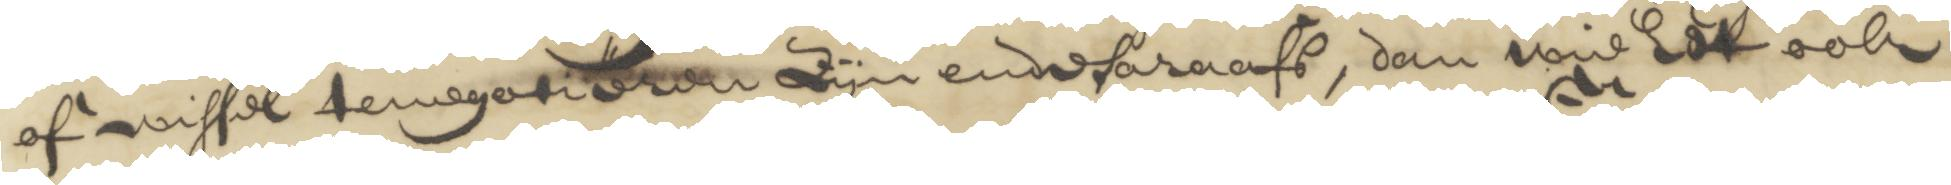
of wissel tenegotieren zijn ende saraafs, dan wie het ook
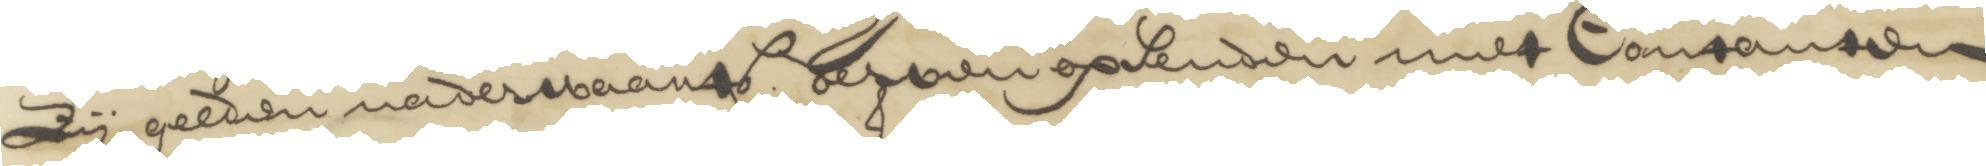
Zij gelden naderwaarts derven opsenden met Contanten
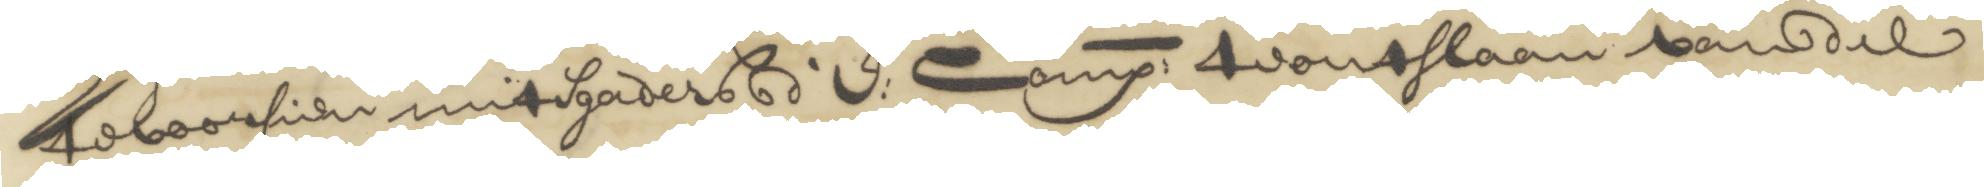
tevoorsien mitsgaders d’ E: Comp: teontslaan van de
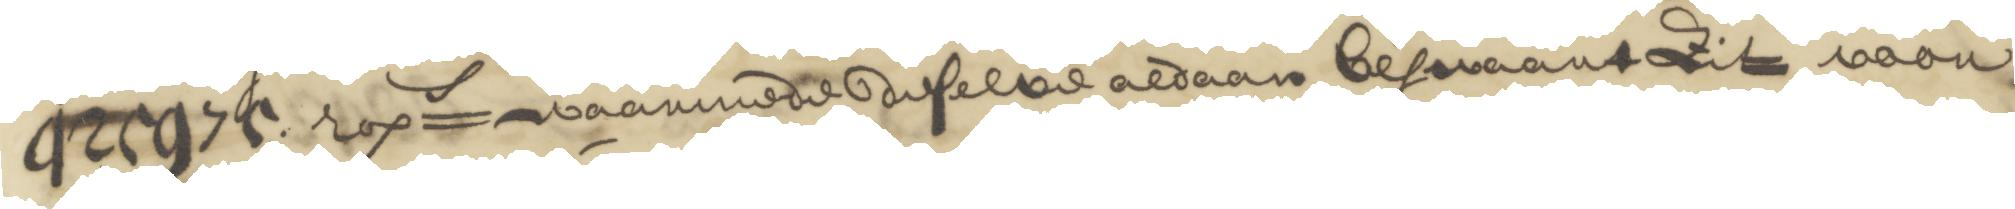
425975. rop=s waarmede deselve aldaar beswaart zit, voor
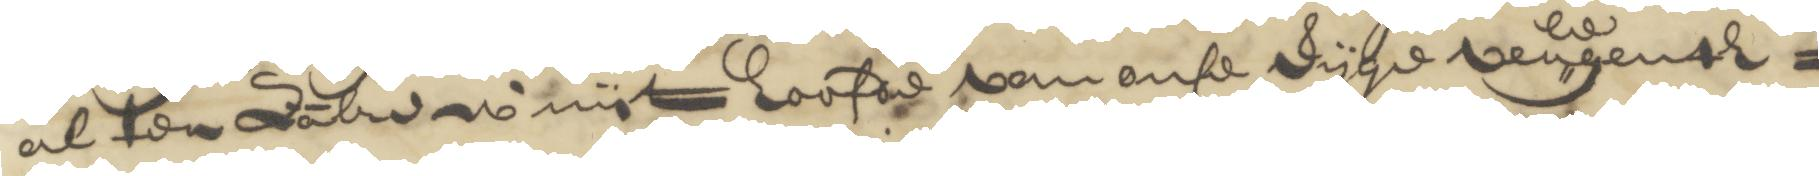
al ten Zake w' uijt hoofde van onse Eijge verlegenth=t
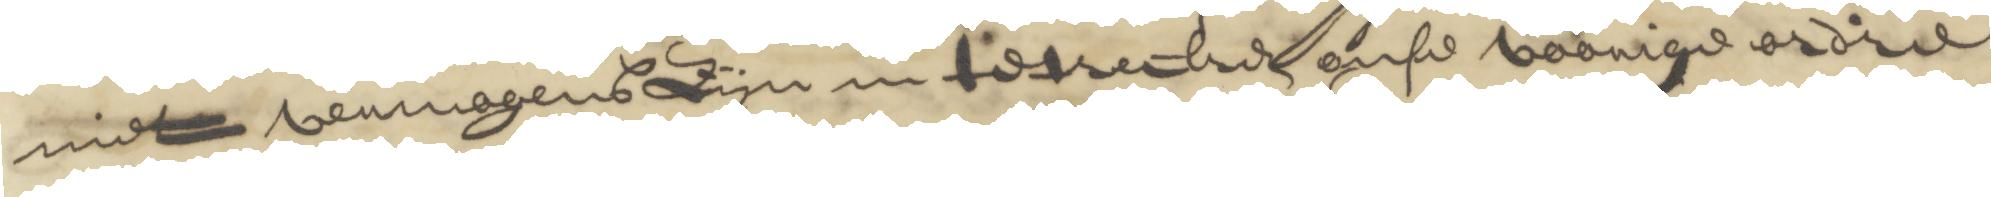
niet vermogens Zijn in tetrecken onse voorige ordre
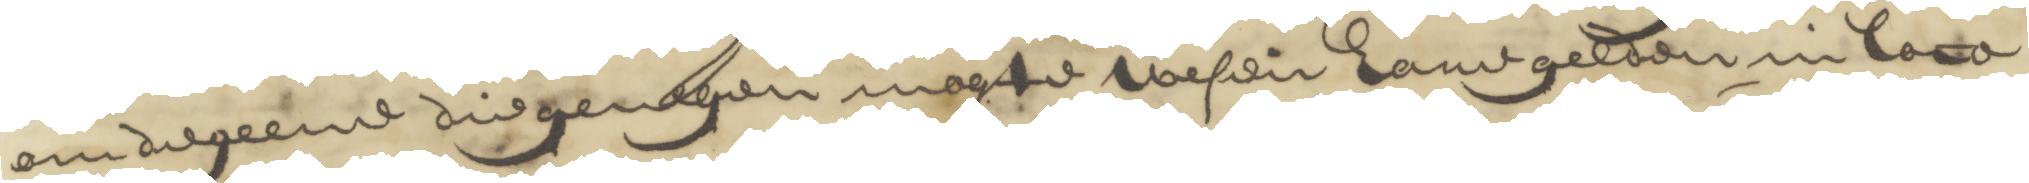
om degeene die genegen mogte wesen hare gelden in loco
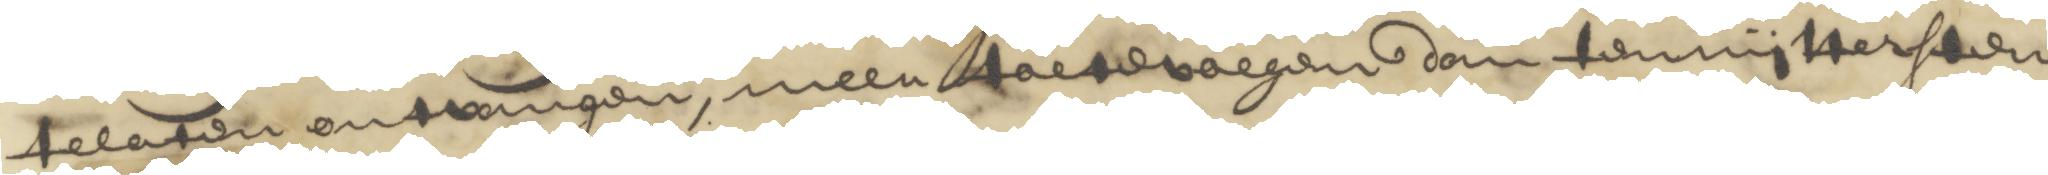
telaten ontvangen, meer toetevoegen dan tenuijttersten
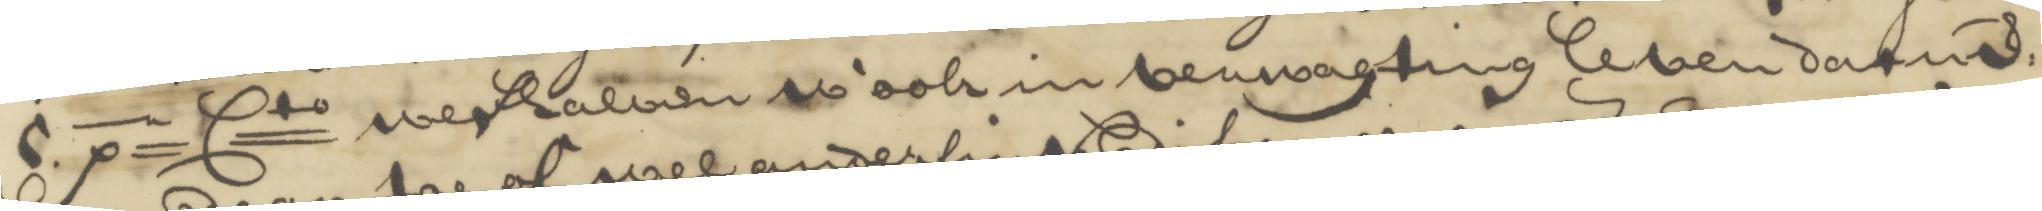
5. p=r C=to weshalven w'ook in verwagting leven dat uE
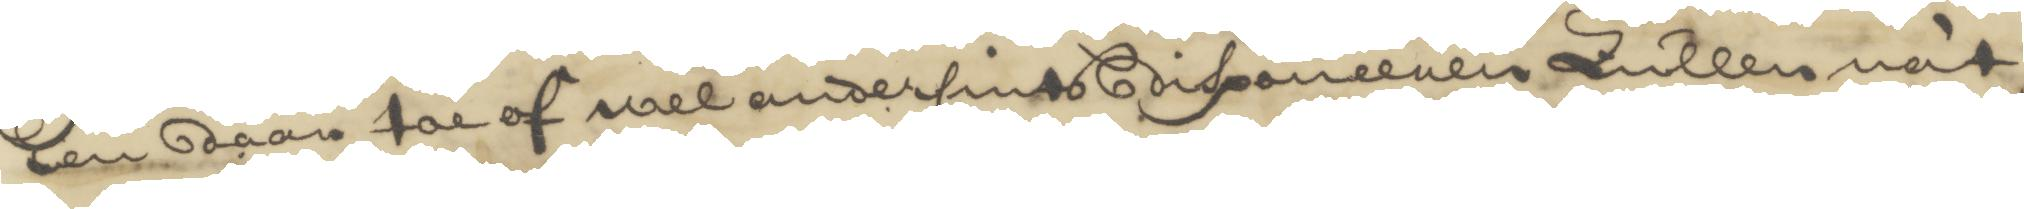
hen daar toe of wel andersints disponeeren zullen na ’t
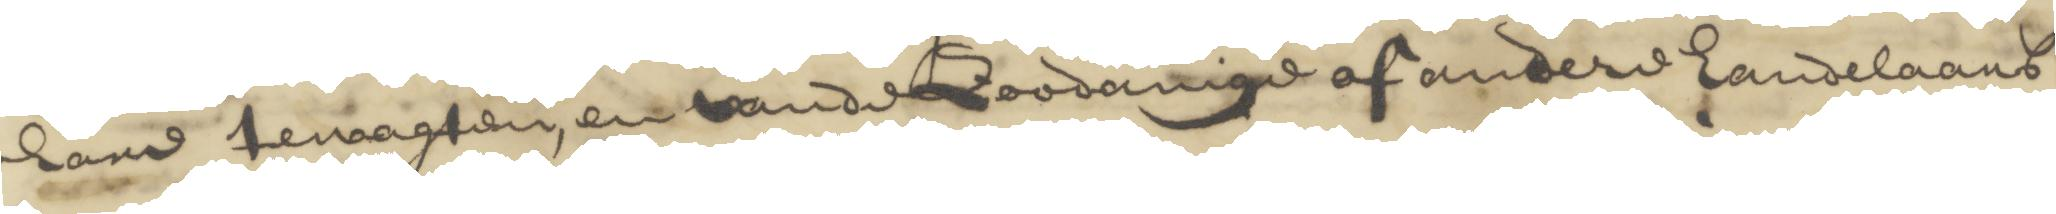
hare tewagten, en vande zoodanige of andere handelaars
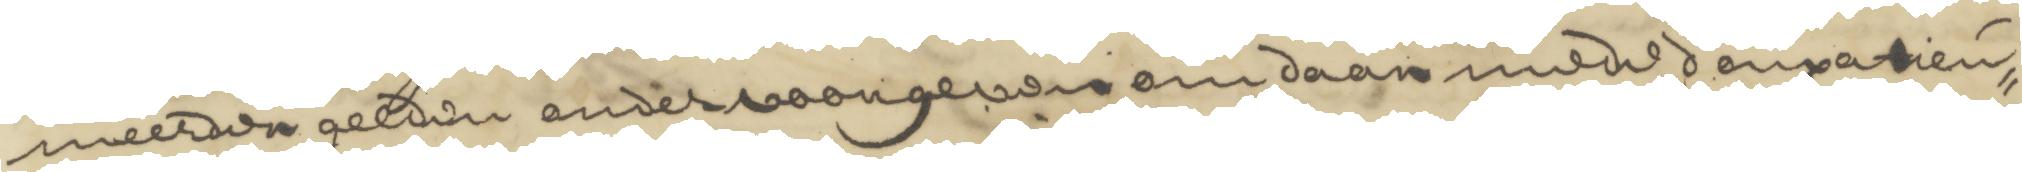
meerder gelden onder voorgeven om daar mede d'enpatieu„
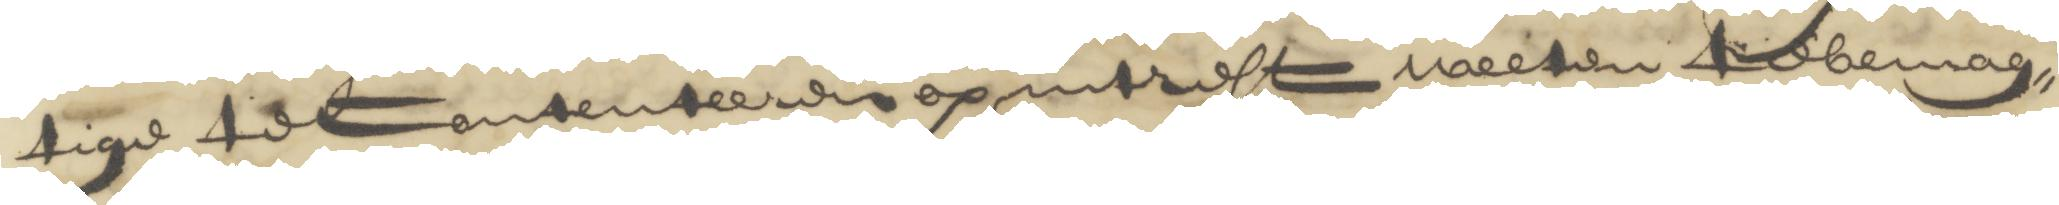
tiqe te Contenteeren op intrest weeten tebemag„
